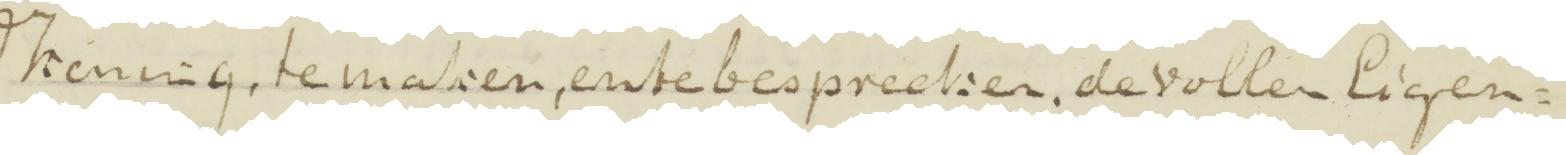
Koning, te maken, en te bespreeken, de vollen Eigen=
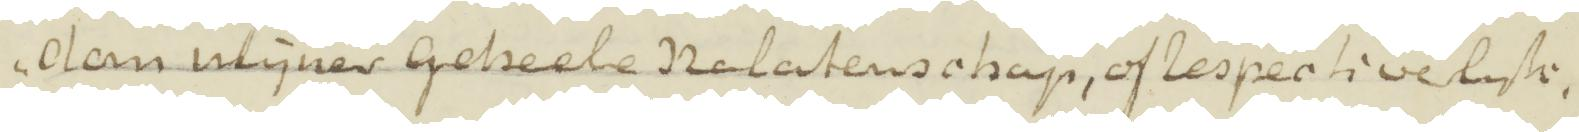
„dom mijner Geheele nalatenschap, of respectivelyk,
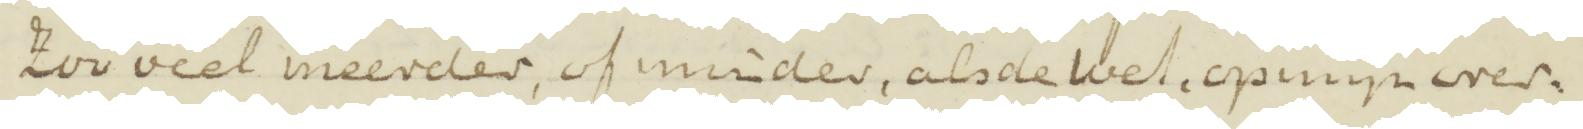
zoo veel meerder, of minder, als de wet, op myn over=
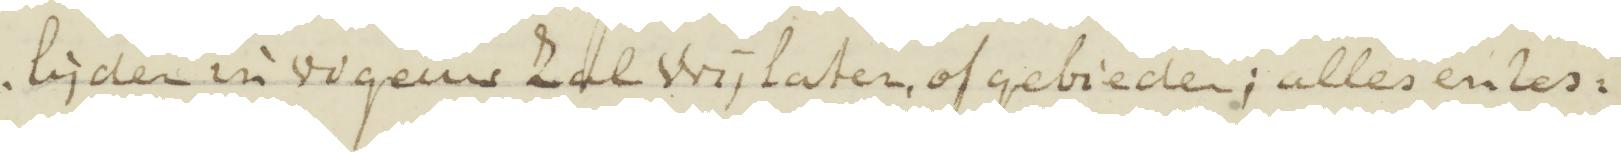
lijden in vigeur zal vrijlaten, of gebieden; alles en res=
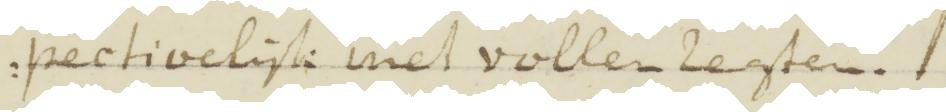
=pectivelijk met vollen regten.
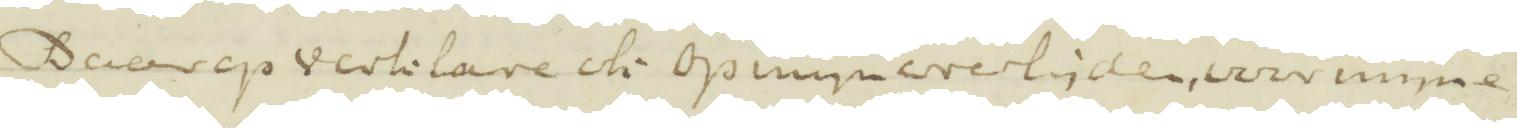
Daarop verklare ik op myn overlijden, voor mijne
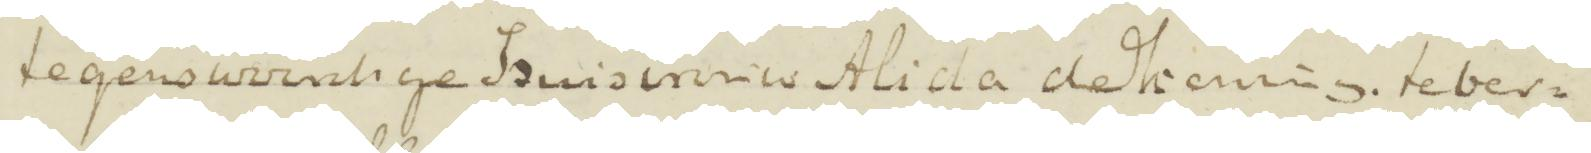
tegenswoordige huisvrouw Alida de Koning, te ver=
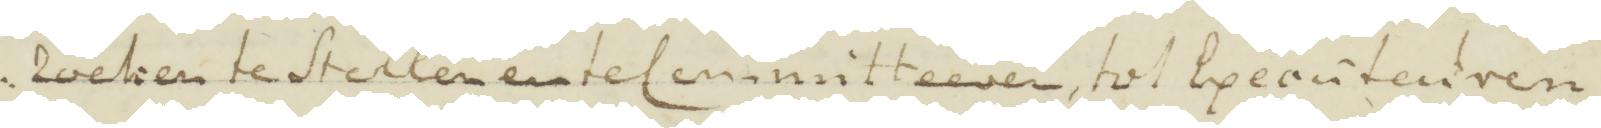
„zoeken te stellen en te Committeeren, tot Executeuren
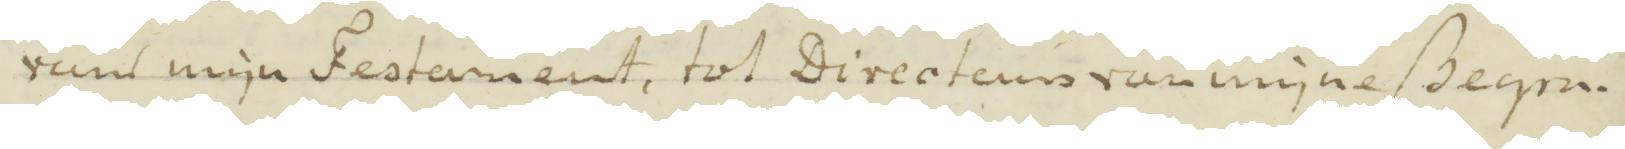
van mijn Testament, tot Directeurs van mijne Begra-
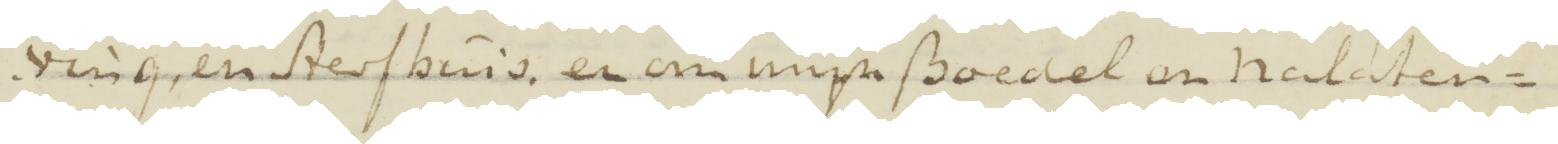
-vingen, en sterfhuis, en om mijn Boedel en nalaten=
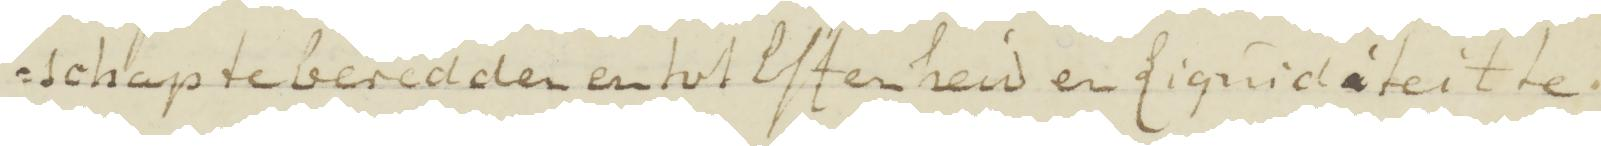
=schap te beredden en tot Effenheid en Liquiditeit te
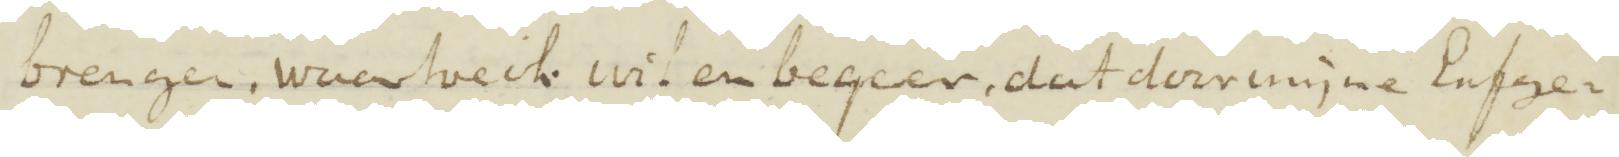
brengen, waartoe ik wil en begeer, dat door mijne Erfge=
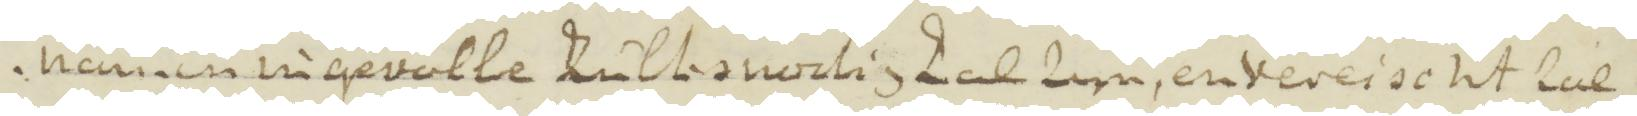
=namen in gevalle zulks nodig zal zijn, en vereischt zal
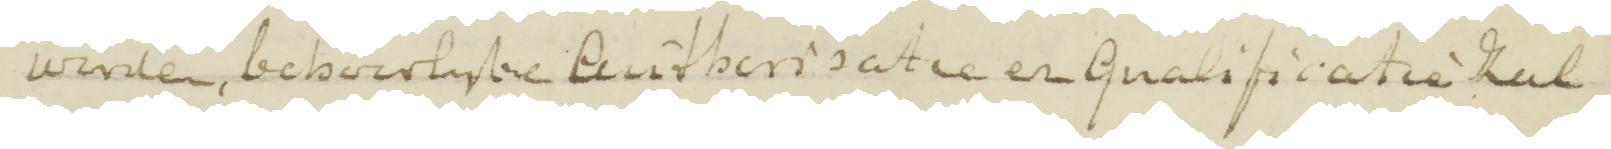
worden, behoorlyke Authorisatie en qualificatie zal
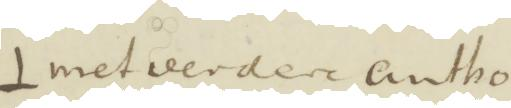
¶ met eerdere autho
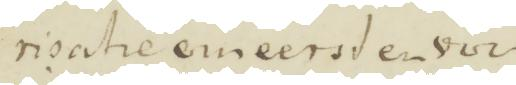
risate en eerst en voo
